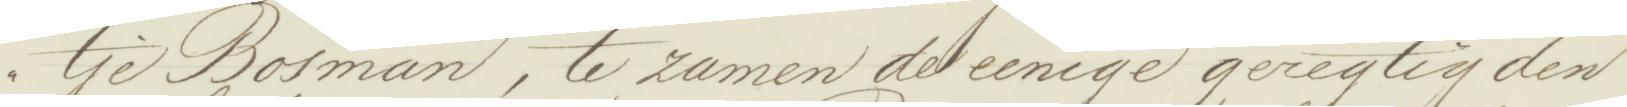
„ „tje Bosman, te zamen de eenige geregtig den
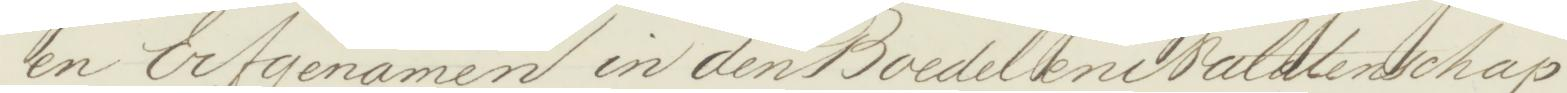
en Erfgenamen in den Boedel en Nalatenschap
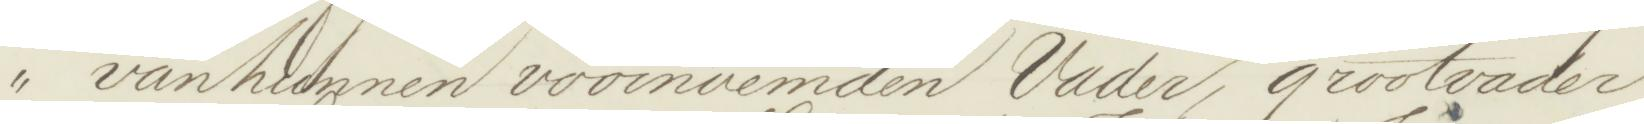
„ van hunnen voornoemden Vader, grootvader
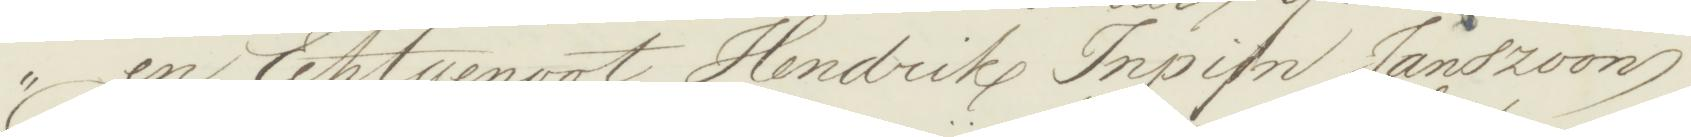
„ en Echtgenoot Hendrik Inpijn Janszoon
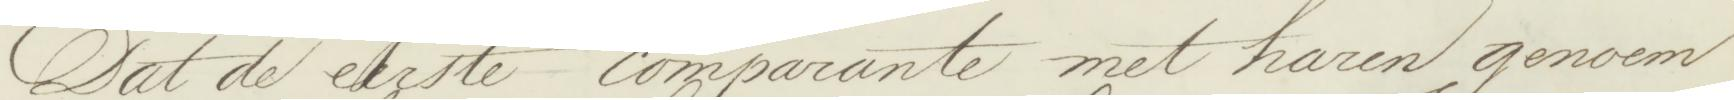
Dat de eerste comparante met haren genoem
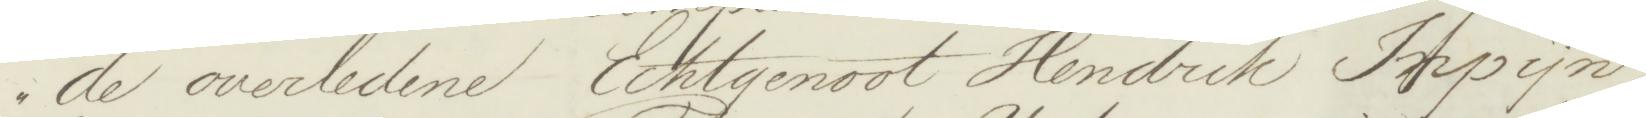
„de overledene Echtgenoot Hendrik Inpijn
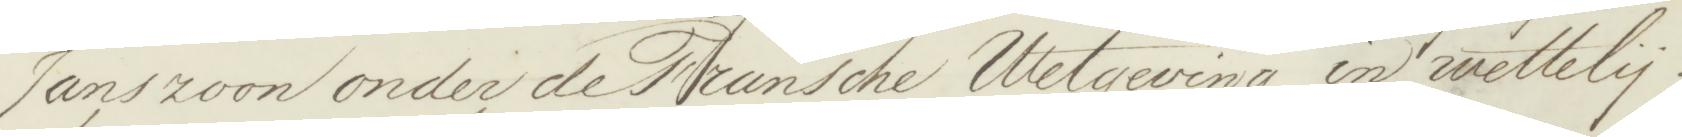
Janszoon onder de Fransche Wetgeving in wettelij„
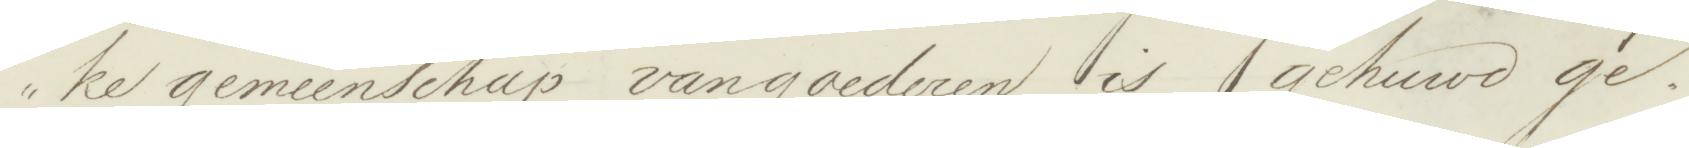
„ke gemeenschap van goederen is gehuwd ge„
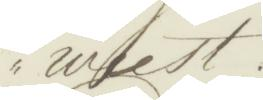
„weest.
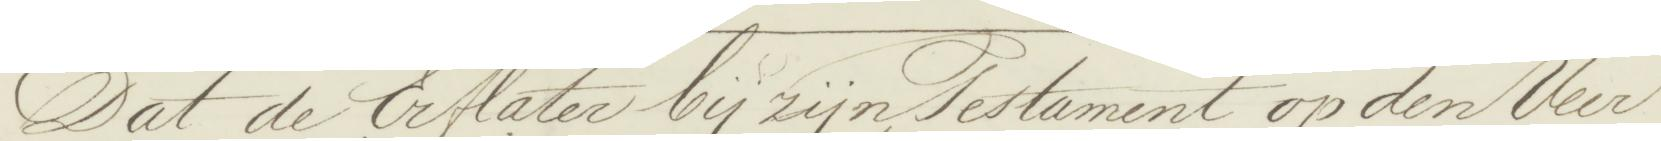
Dat de Erflater bij zijn Testament op den Veer
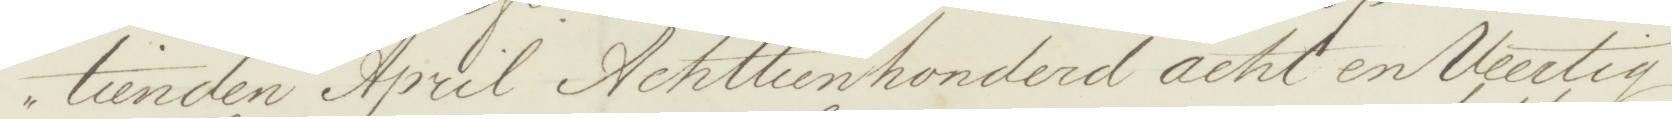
„tienden April Achttienhonderd acht en Veertig
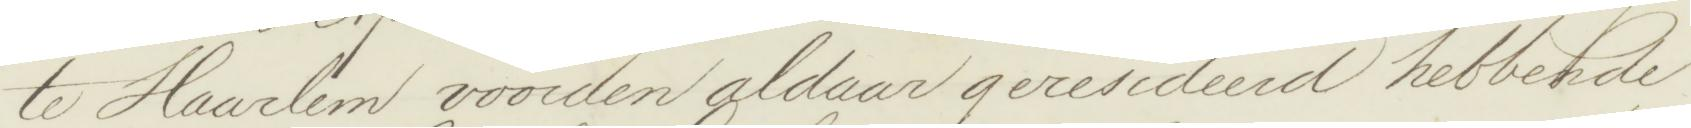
te Haarlem voor den aldaar geresideerd hebbende
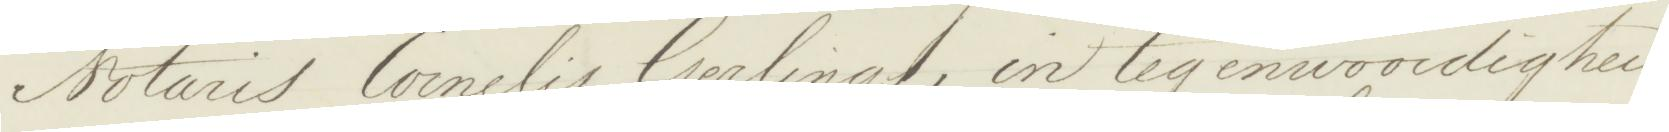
Notaris Cornelis Gerlings, in tegenwoordigheid
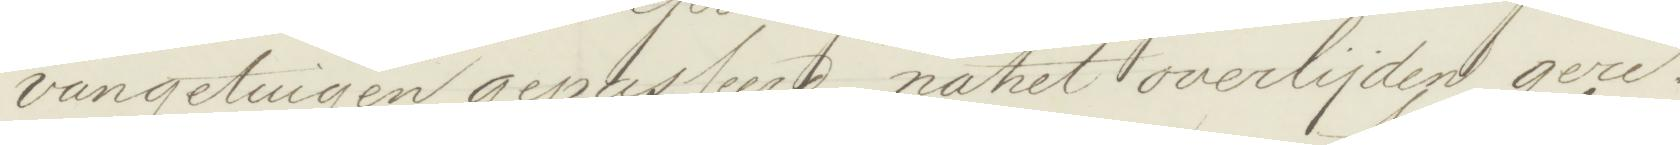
van getuigen gepasseerd na het overlijden gere„
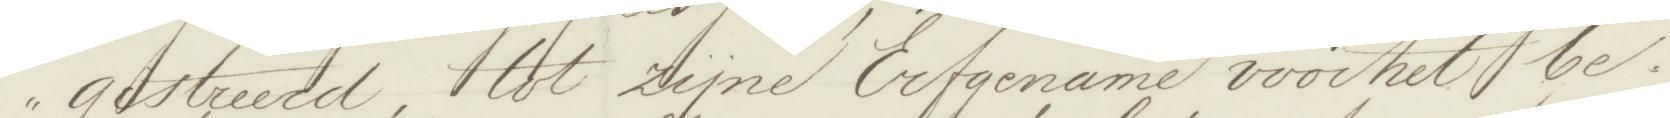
„gistreerd tot zijne Erfgename voor het be„
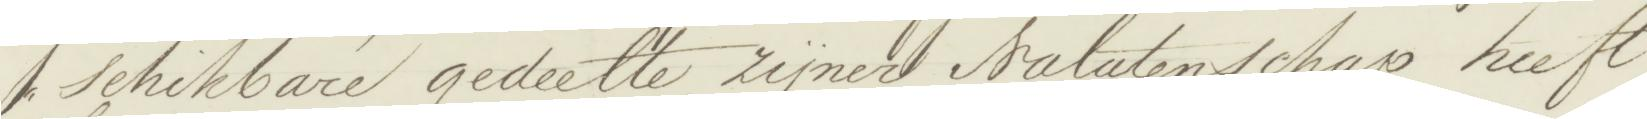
„schikbare gedeelte zijner Nalatenschap heeft
